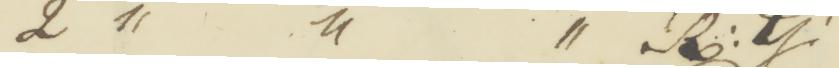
2 „ „ „ R: G:
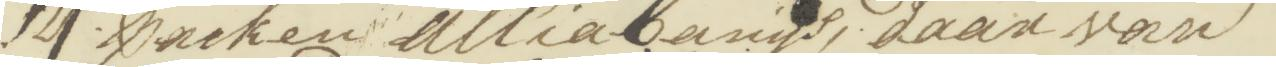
14. packen allia banijs, daar van
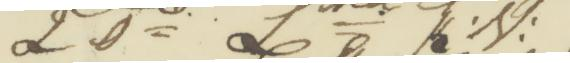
2 d=o L=ra k: N:
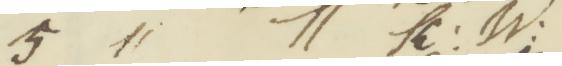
5 „ „ k: W:
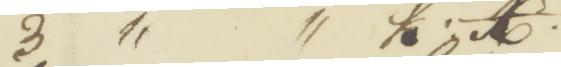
3 „ „ k: X:
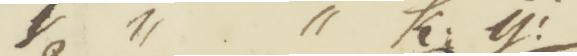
1 „ „ k: ij:
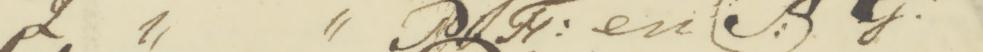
2 „ „ P: F: en P: G:
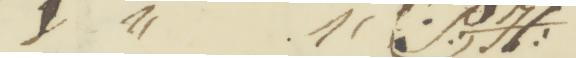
1 „ „ P: H:
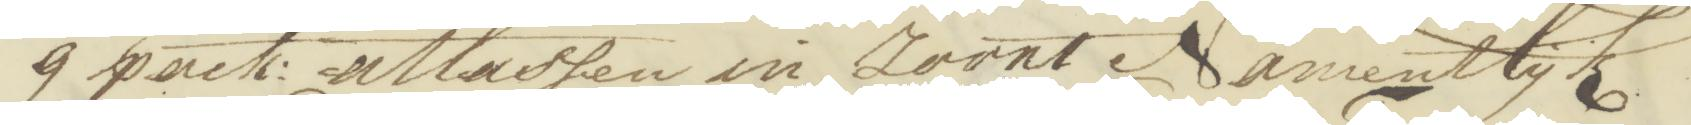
9 pack: atlassen in zoort Namentlijk
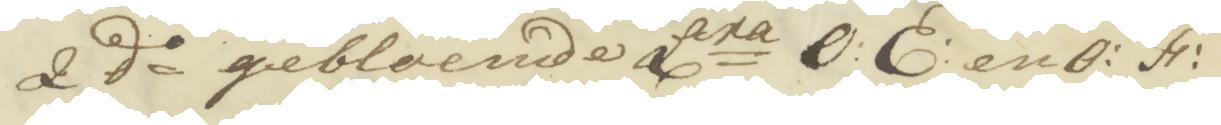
2 d=o gebloemde L=ra O: E: en O: F:
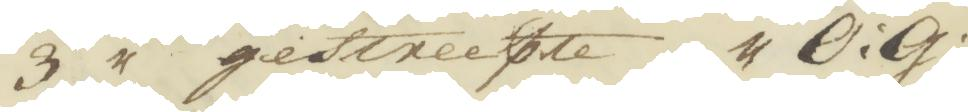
3 „ gestreepte „ O: G:
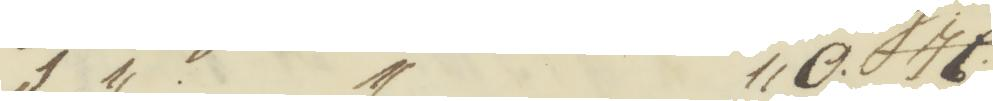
1 „ „ „ O: H:
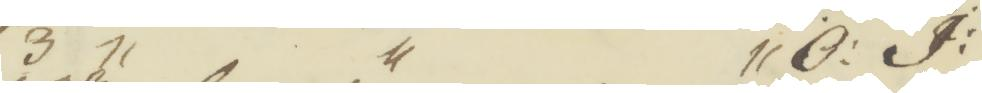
3 „ „ „ O: I:
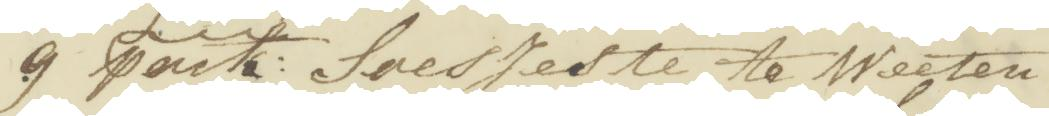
9 pack: soesjeste te weeten
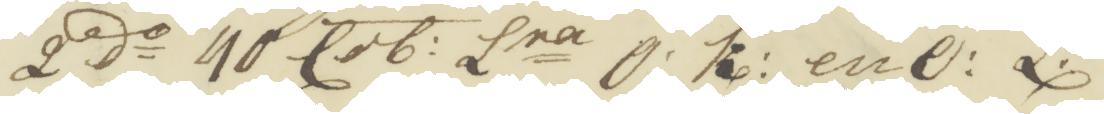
2 d=o 40 Cob: L=ra O: k: en O: L:
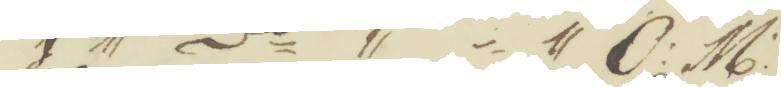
1 „ _=o „ „ O: M:
